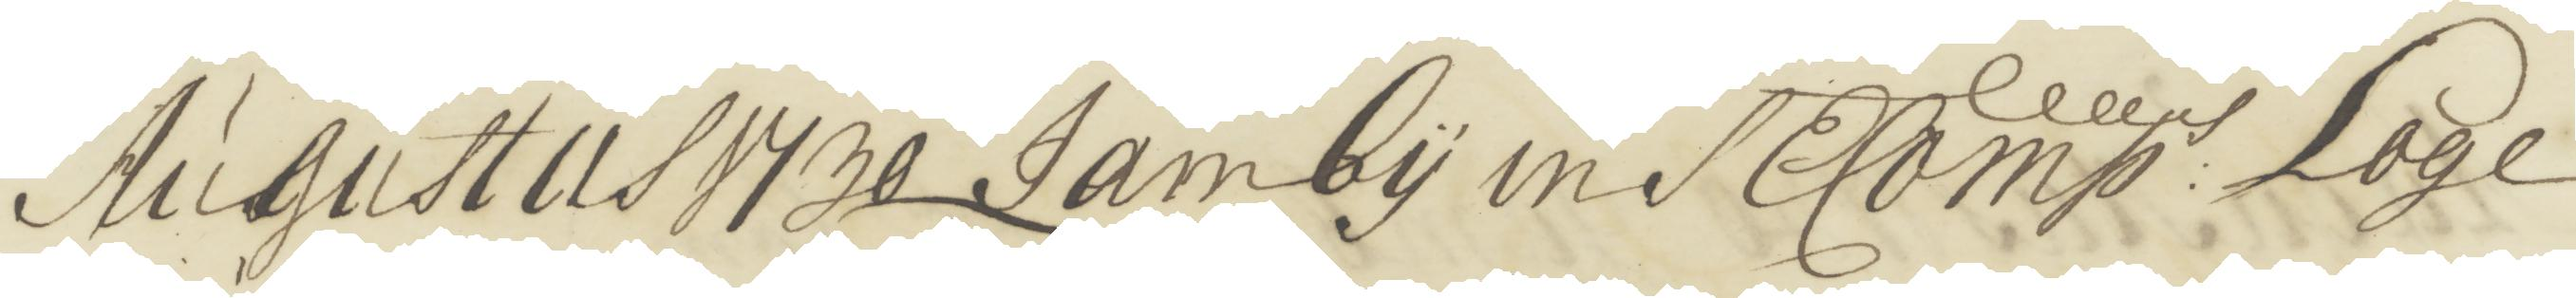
Augustus 1730 Jambij in sE: Comp:s Loge
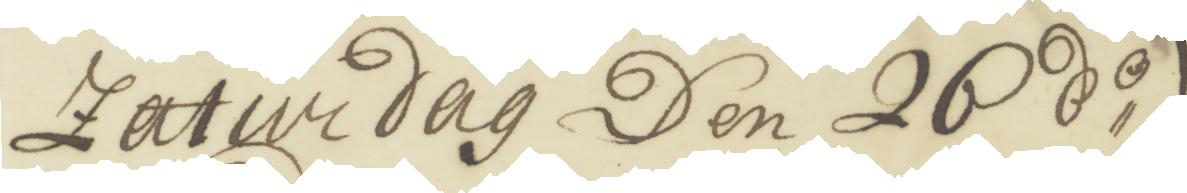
Zaturdag Den 26 d„o
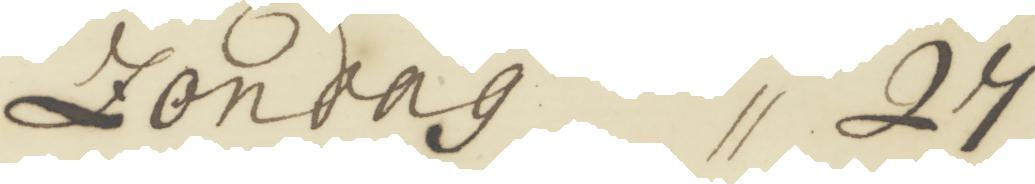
zondag „ 27
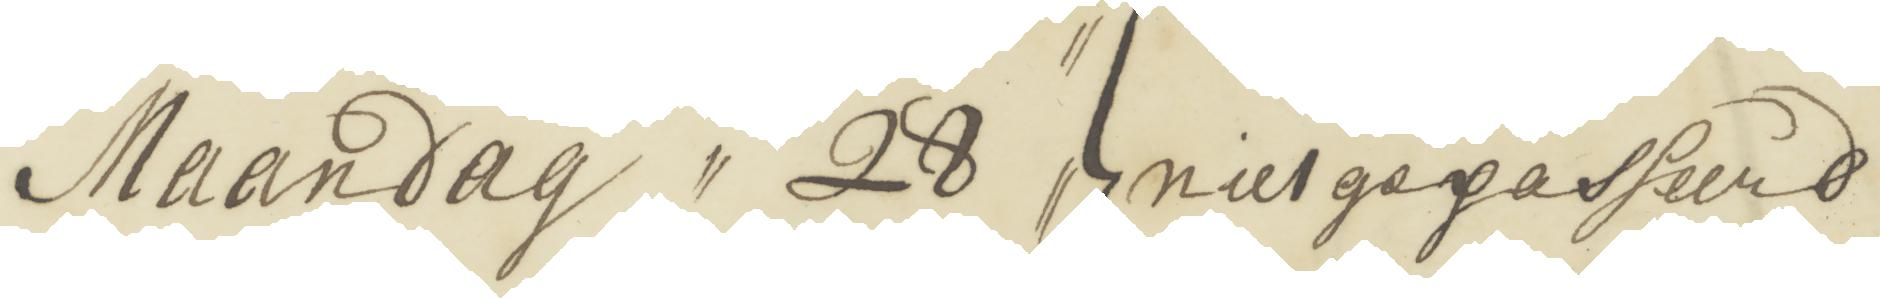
Maandag „ 28 „ niet gepasseerd
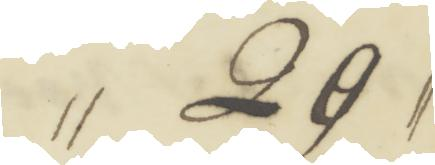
„ 29 „
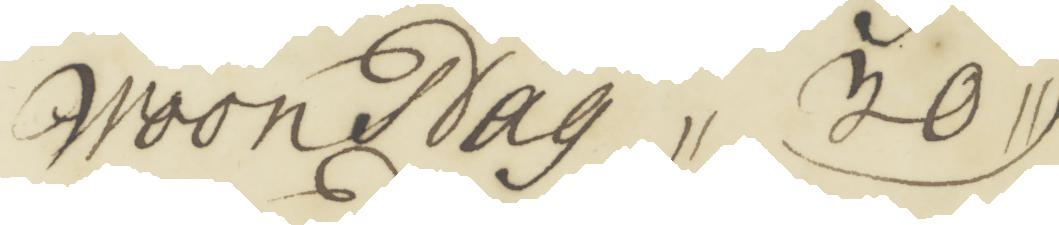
Woonsdag „ 30 „
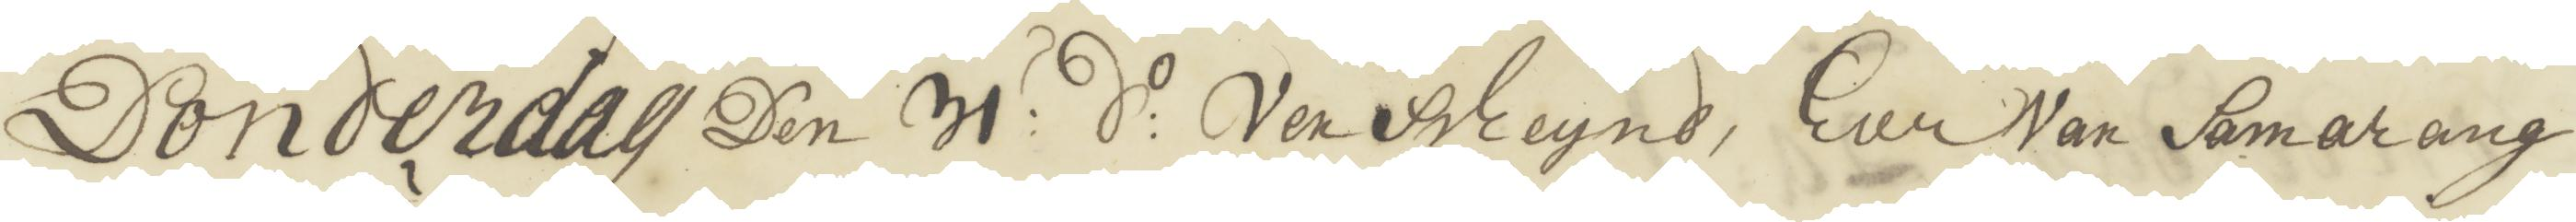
Donderdag Den 31:' d:o verscheynd, hier van Samarang
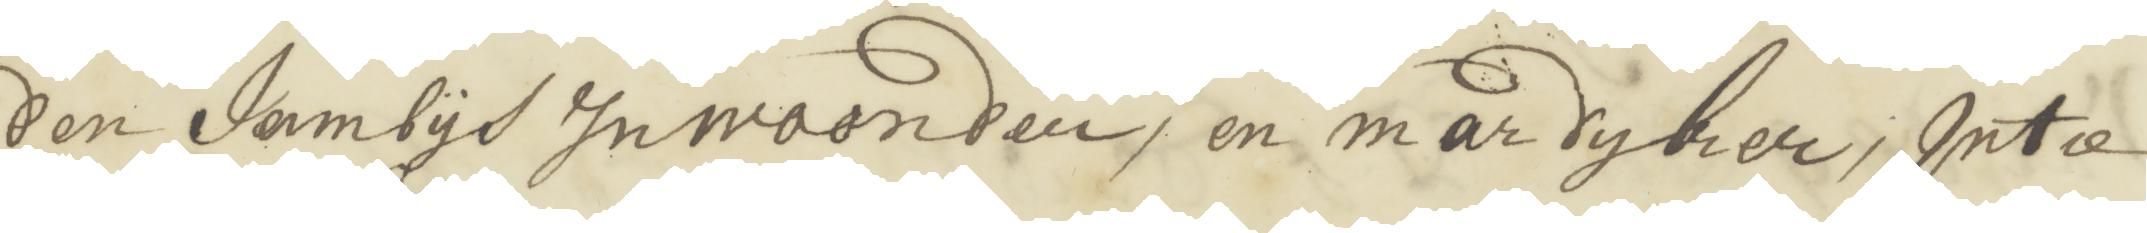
den Jambijs Jnwoonden, en mardyker; inte
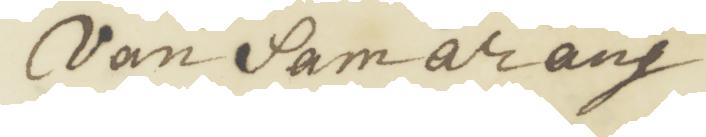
van Samarang
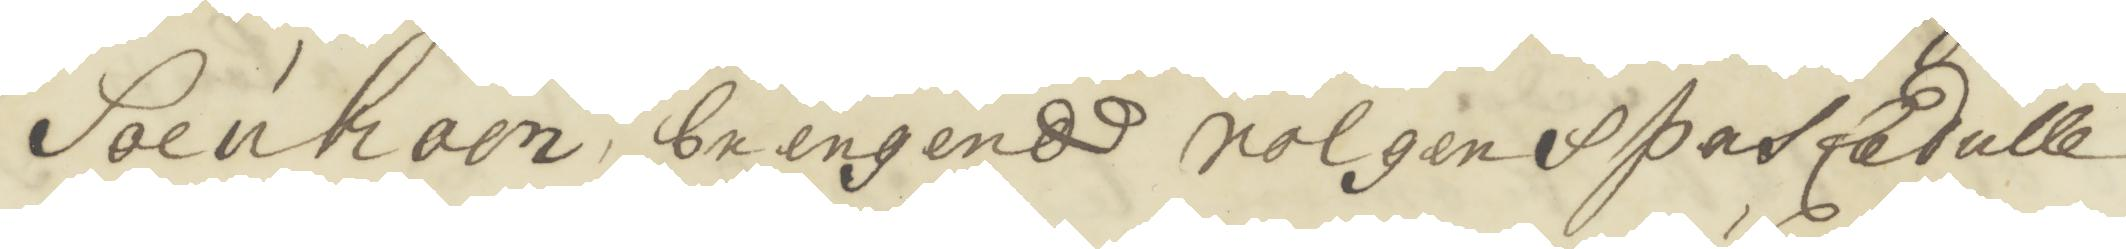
Soenkoor, brengende volgens pas cedulle
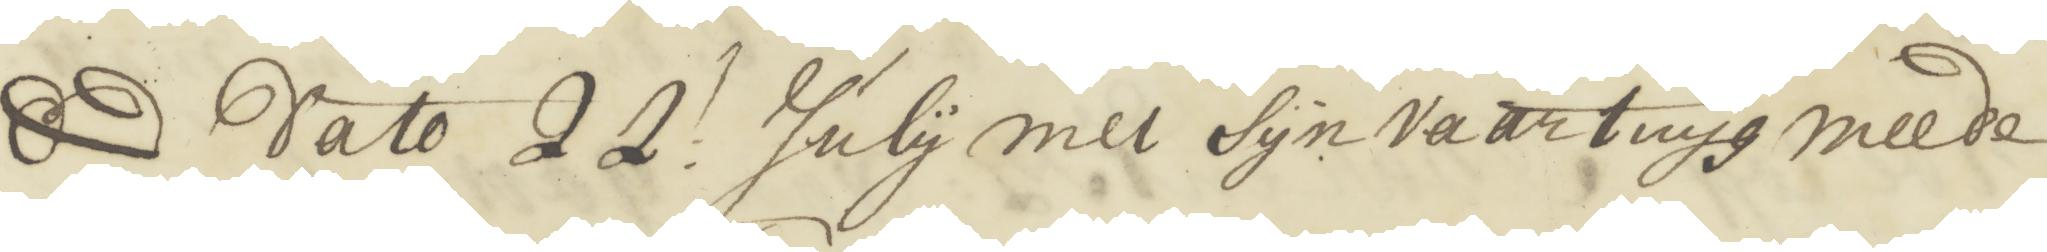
de dato 22:' Julij met sijn vaartuijg meede
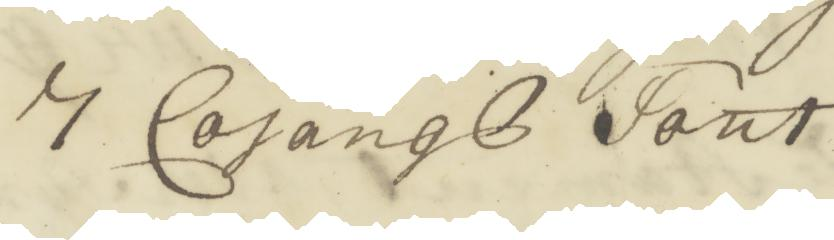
7 Cojangs Tont
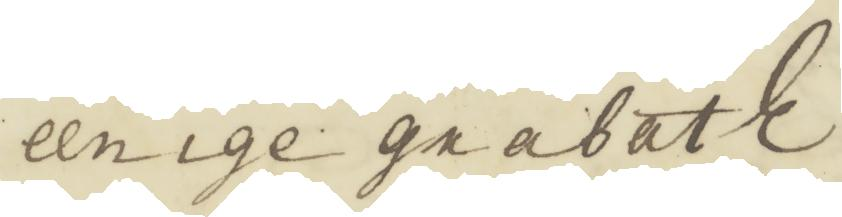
eenige grabath
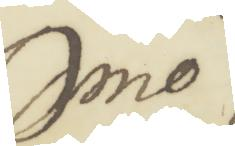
Mo
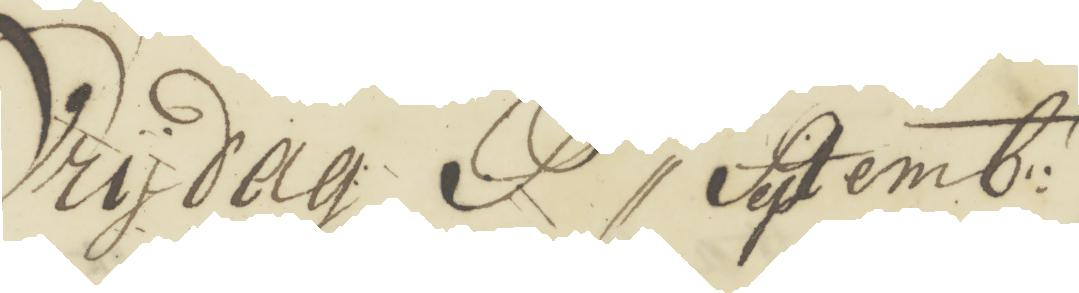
Vrijdag P„ Septemb.:
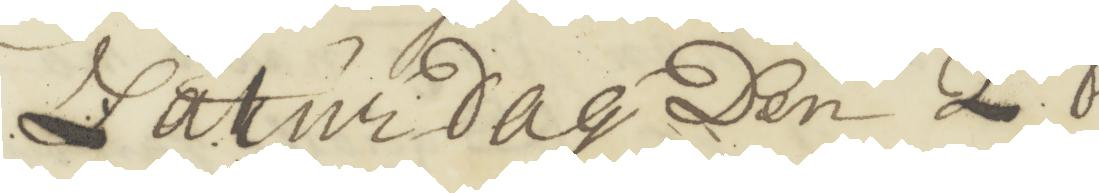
Zaturdag den 2. d„o
